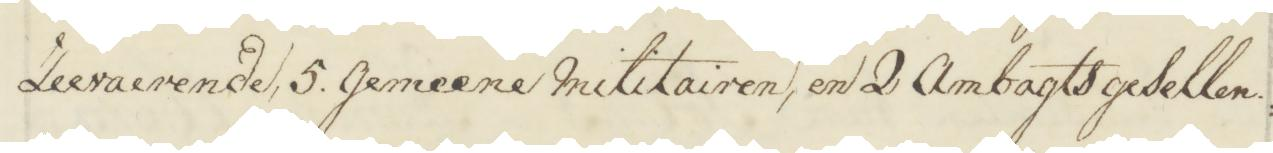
Zeevaerende, 5. gemeene militairen, en 2: Ambagts gesellen.
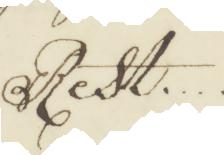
Rest...
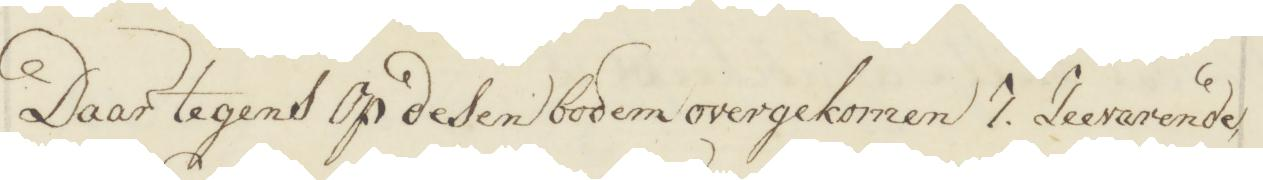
Daar tegens op desen bodem overgekomen 7. Zeevarende,
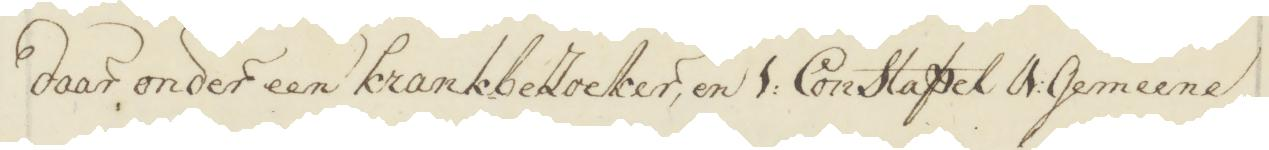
daar onder een krankbezoeker, en 1: Constapel 4: Gemeene
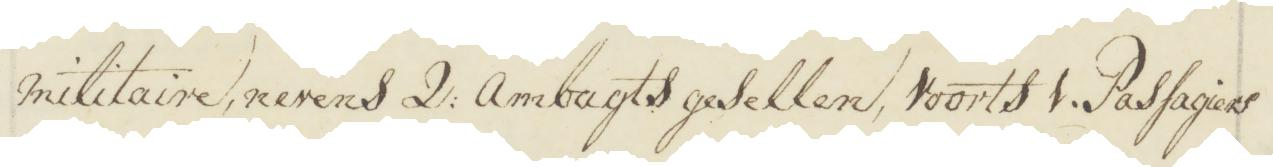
militaire, nevens 2: Ambagts gesellen, voorts 1 Passagiers
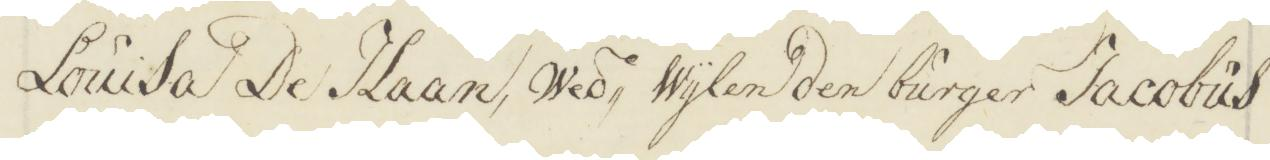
Louisa De Ilaan, wed„e wijlen den burger Jacobus
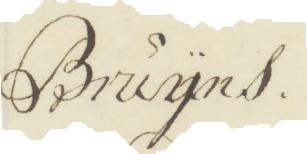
Bruijns.
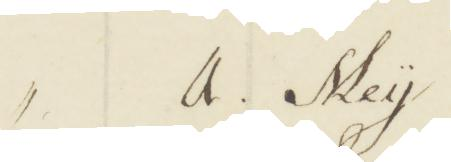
„ 4. Meij
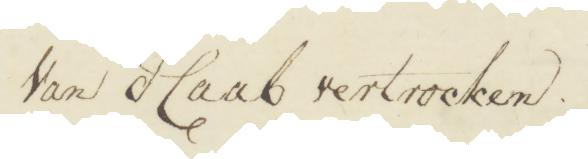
Van d'Caab vertrocken.
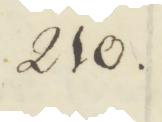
210.
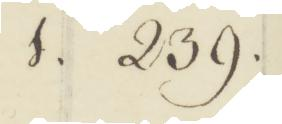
1. 239.
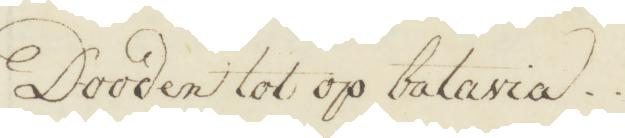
Dooden tot op batavia ..
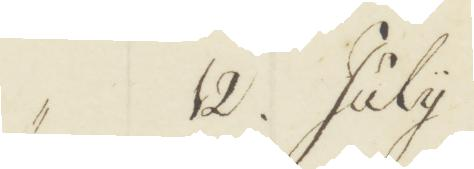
„ 12. Julij
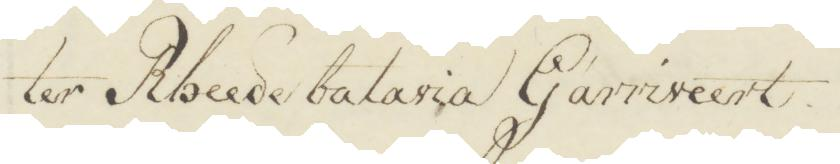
ter Rheede batavia G'arriveert
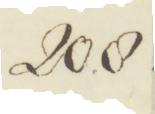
208.
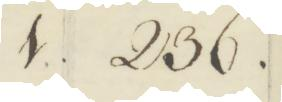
1. 236.
